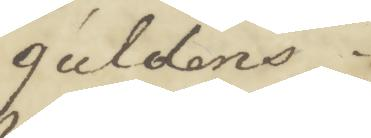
guldens . . . . . . . . . . . . „ 80. —
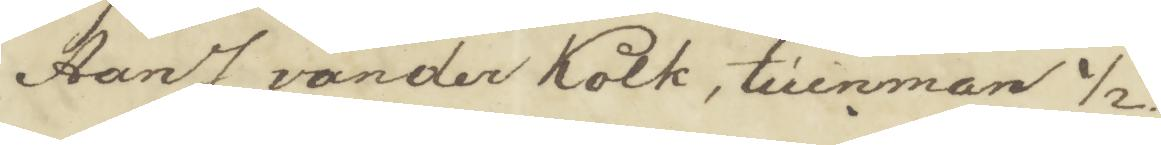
Aan J van der Kolk, tuinman ½.
